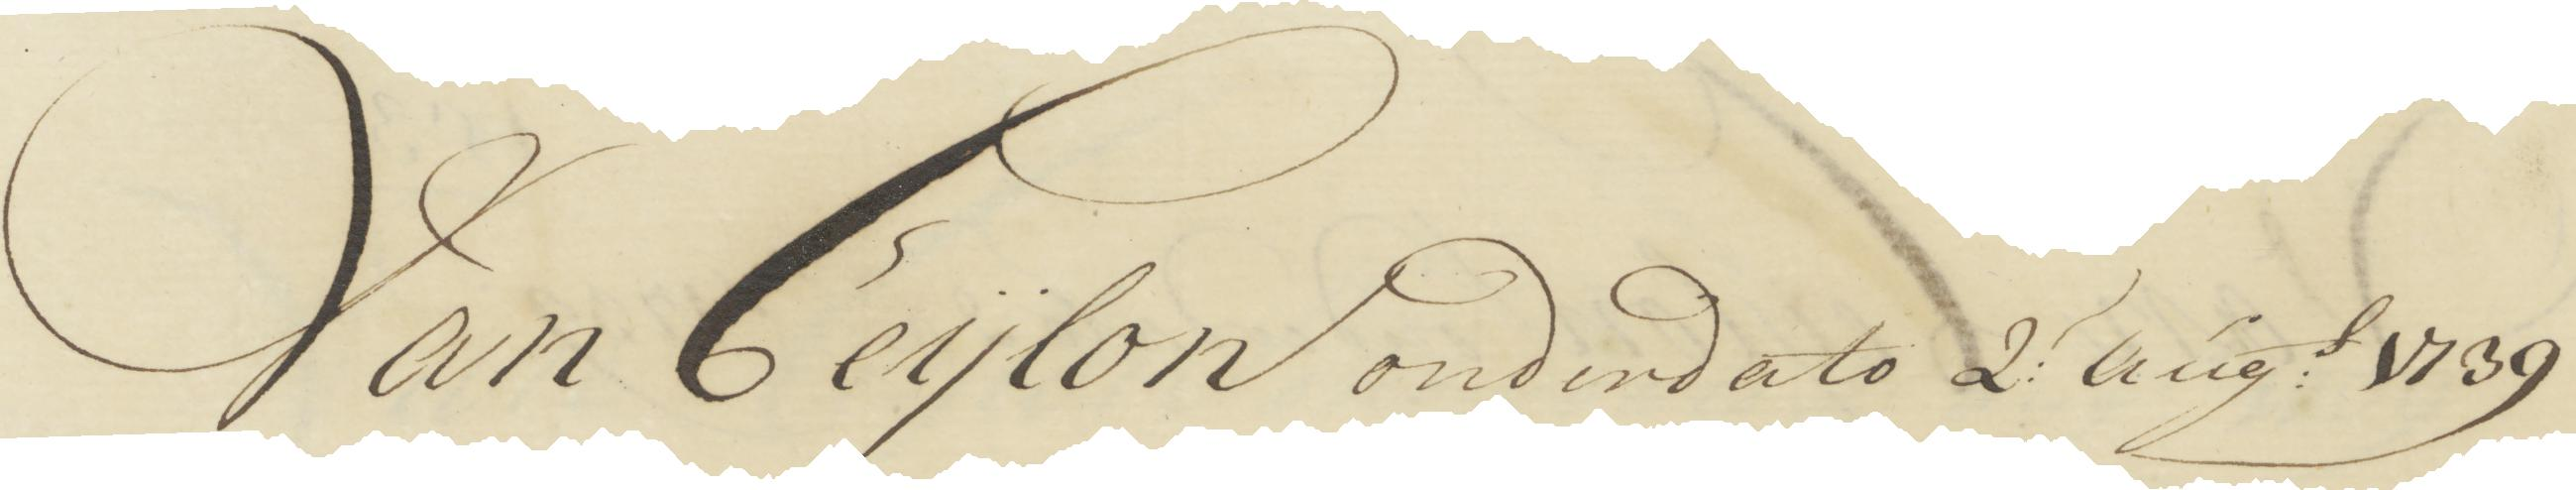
Van Ceijlon onder dato 2:' aug:s 1739
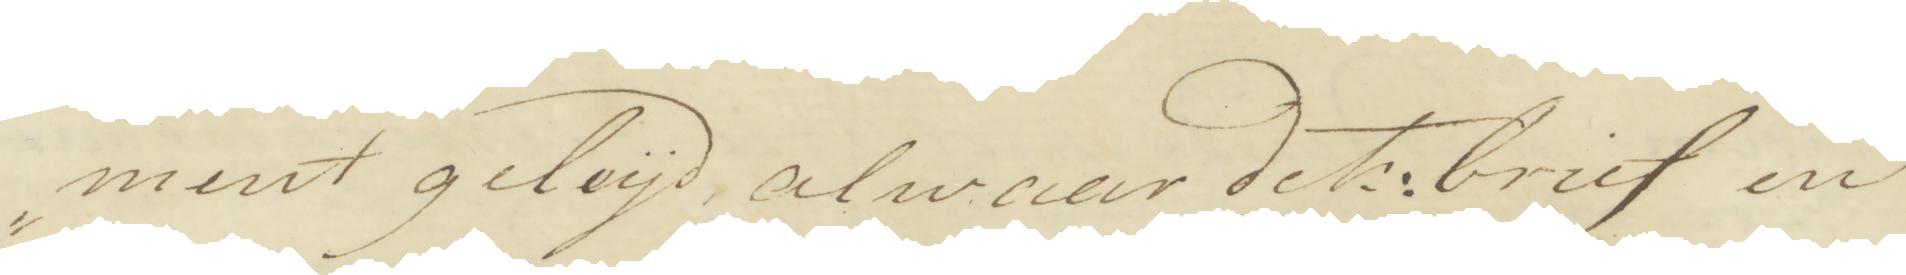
„ment geleijd, alwaar dek: brief en
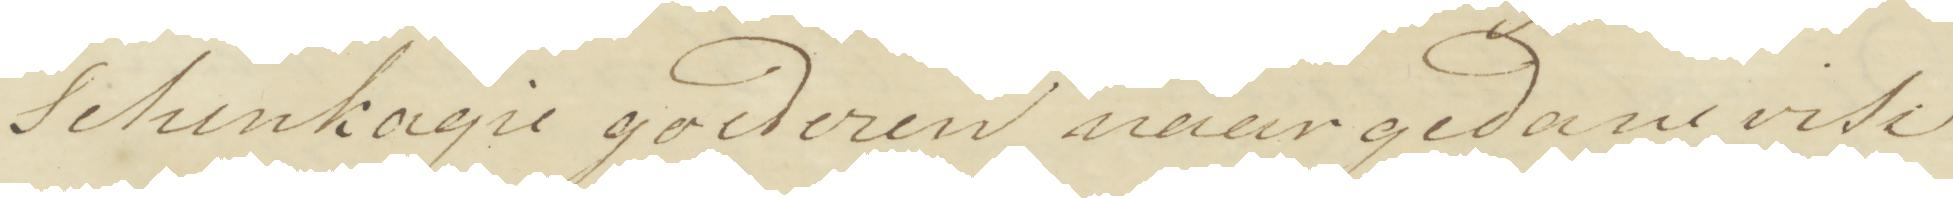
schenkagie goederen naar gedane visi
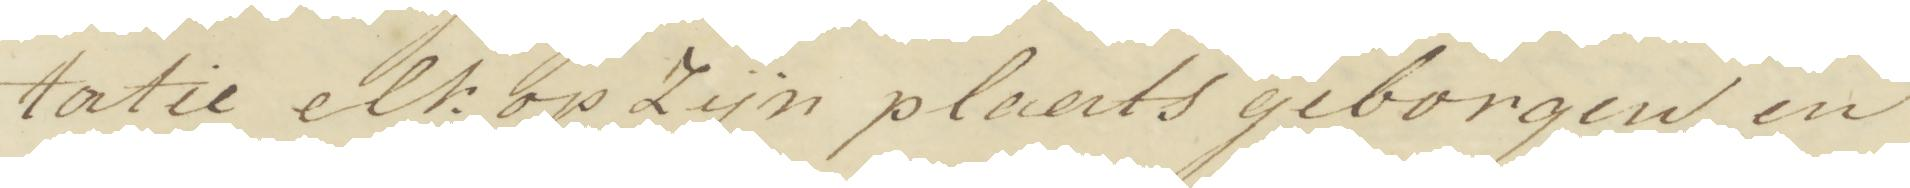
tatie elk op zijn plaats geborgen en
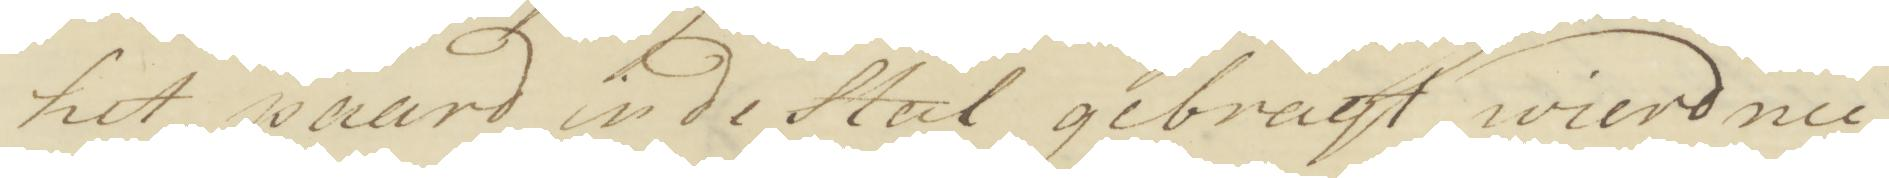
het paard in de stal gebragt wierd nee
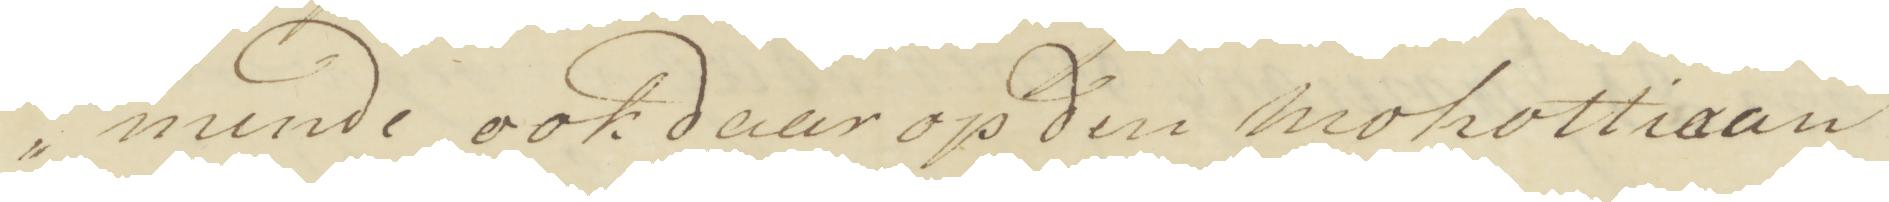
„mende ook daar op den mohottiaan
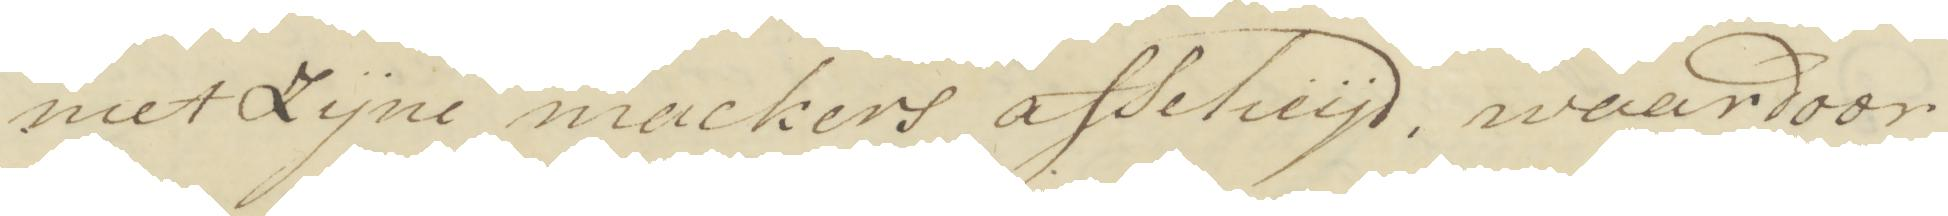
met zijne mackers afscheijd, waar door
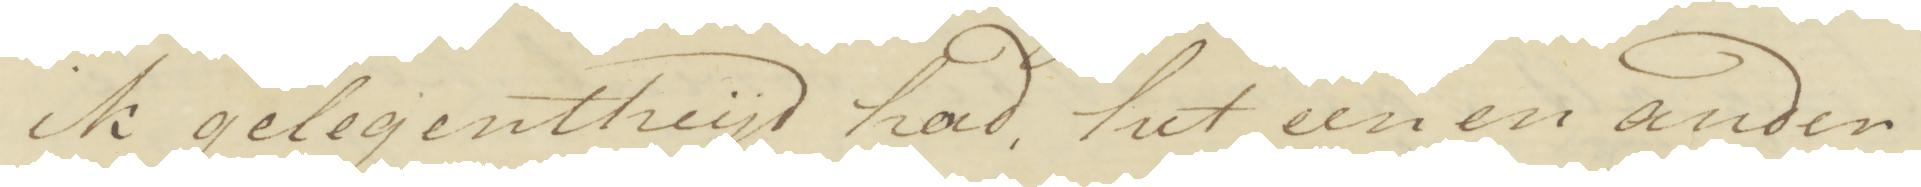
ik gelegentheijd had, het een en ander
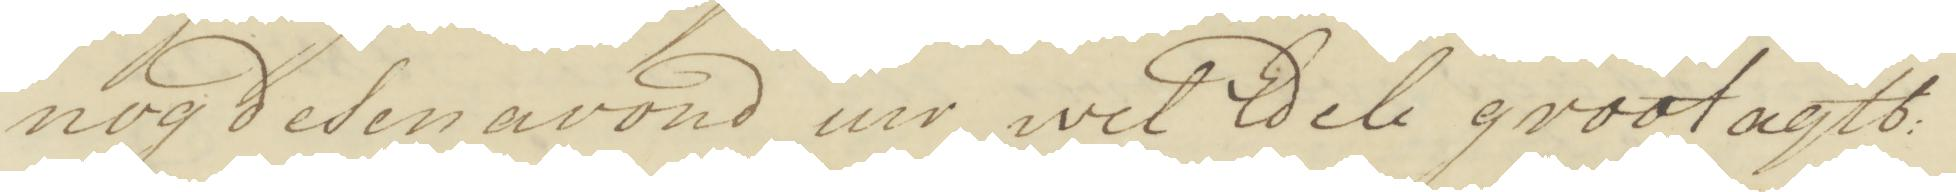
nog desen avond uw wel Edele groot agtb:
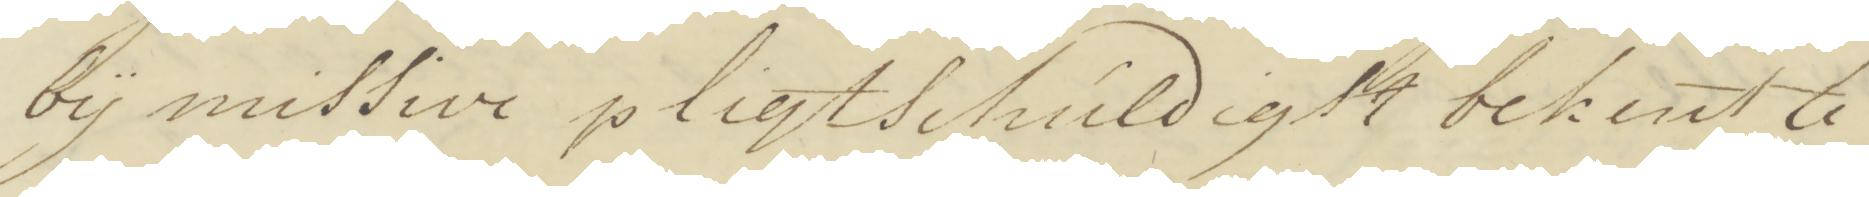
bij missive pligtschuldigst bekent te
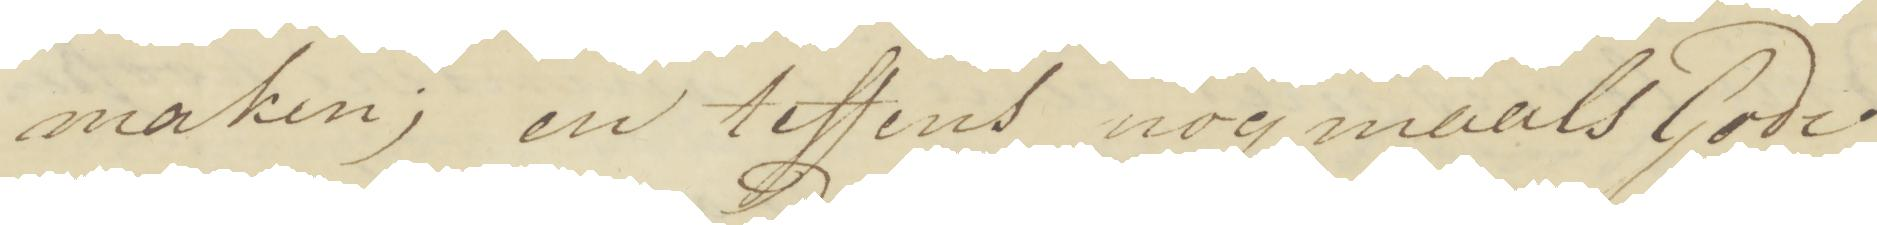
maken; en teffens nog maals Gode
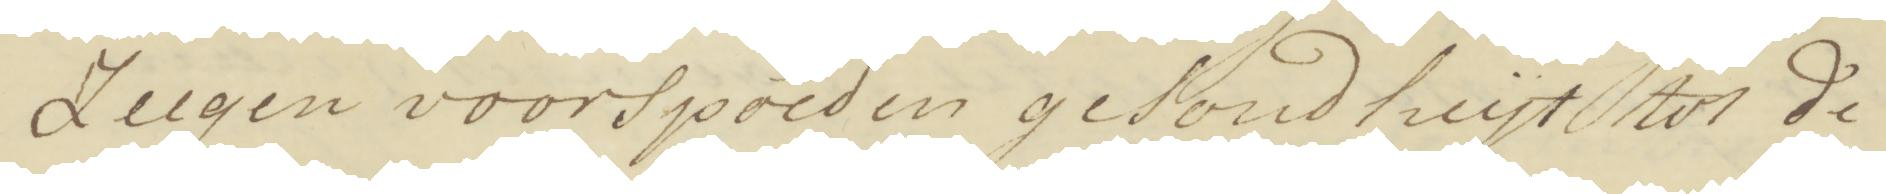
zeegen voorspoeden gesondheijt tot de
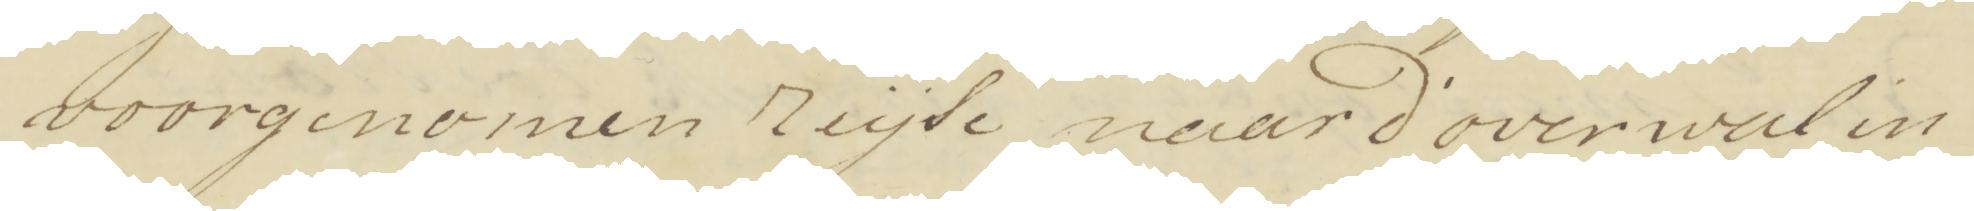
voorgenomen reijse naar d' overwal in
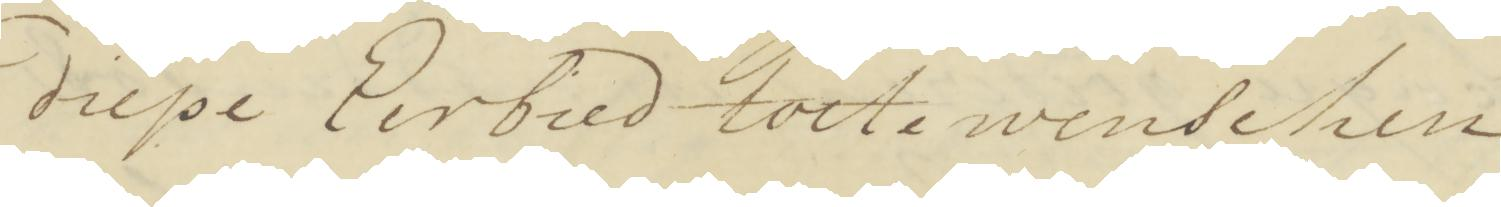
diepe Eerbied toetewenschen
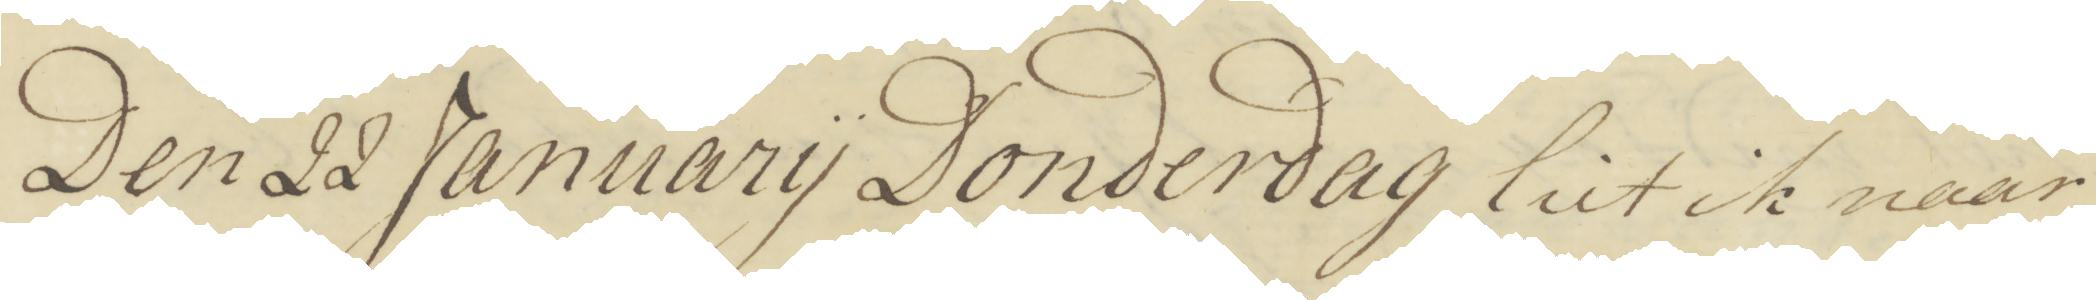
Den 22 Januarij Donderdag liet ik naar
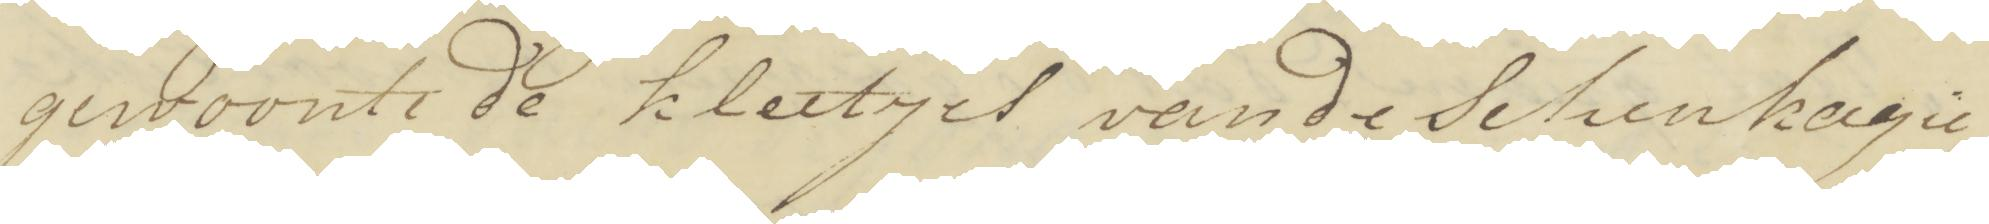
gewoonte de kleetjes van de schenkagie
